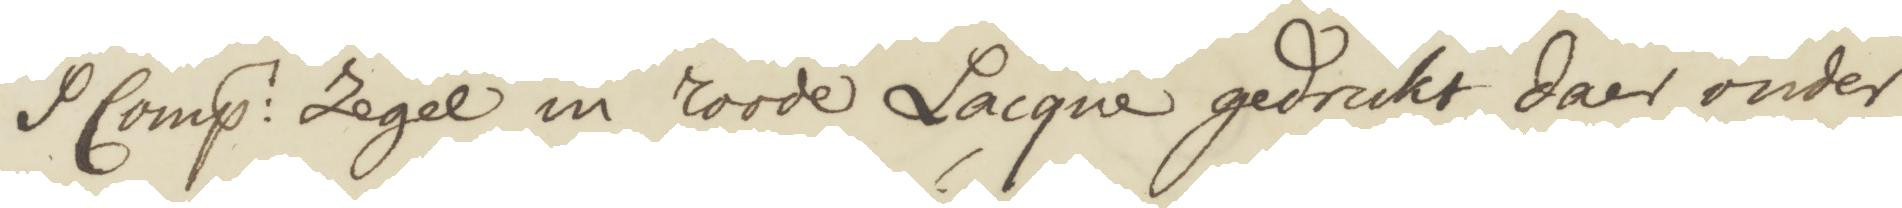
's Comp:s zegel in roode Lacque gedrukt daer onder
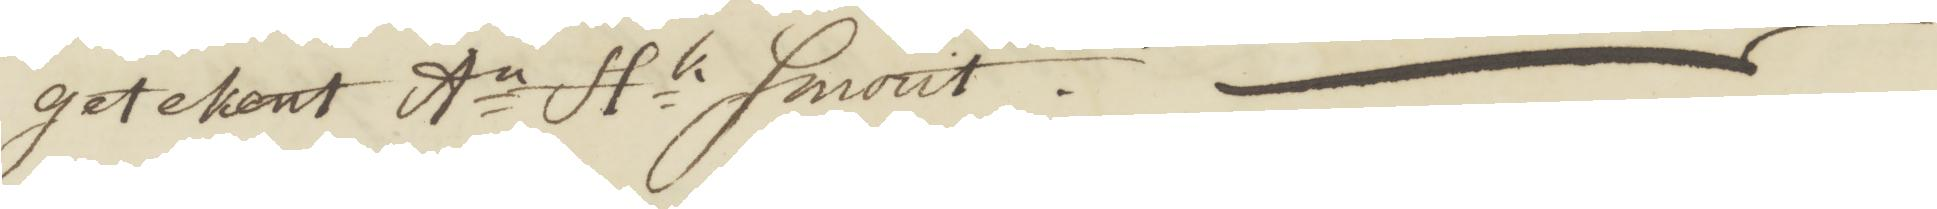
getekent A=n H=k smout. —
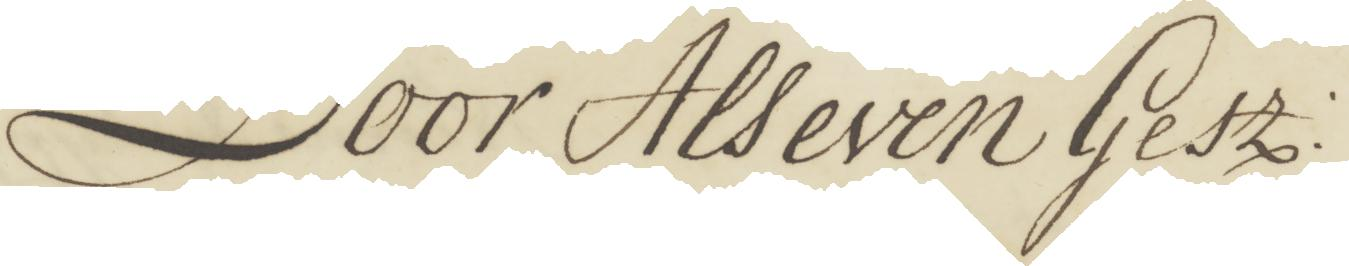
Door Alseven Gesz:
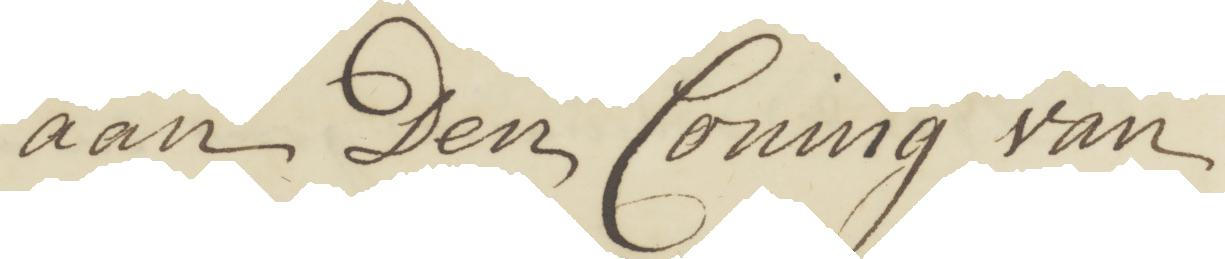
aan Den Coning van
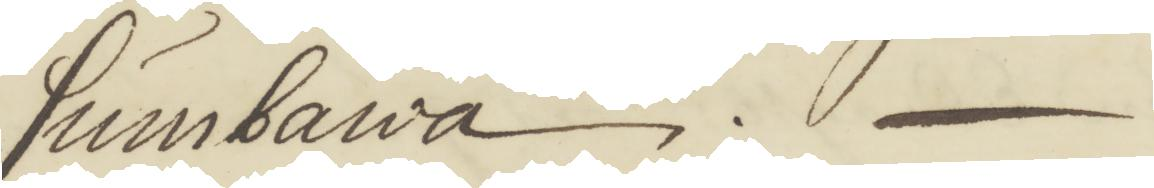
sumbawa. —
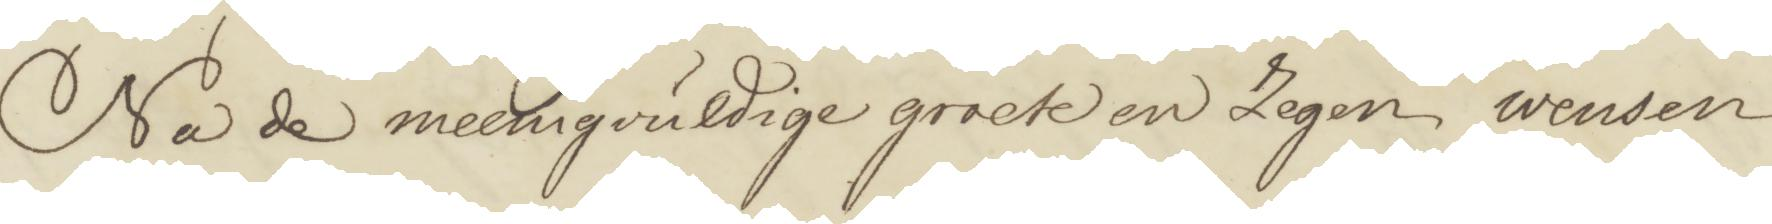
Na de meenigvuldige groete en zegen wensen
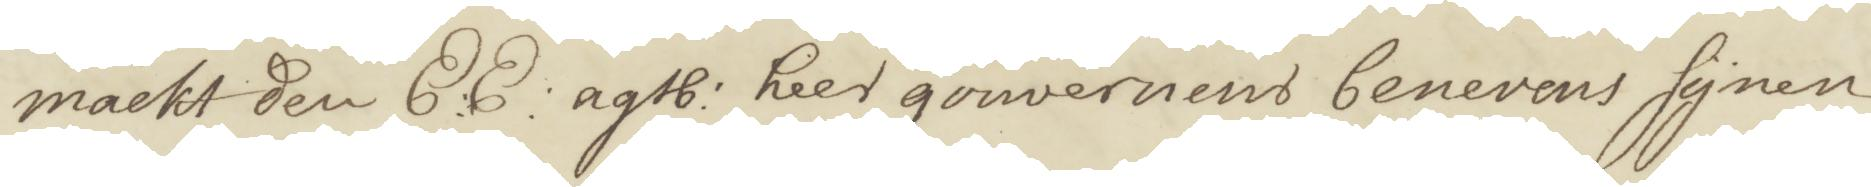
maekt den E: E: agtb: heer gouverneur benevens sijnen
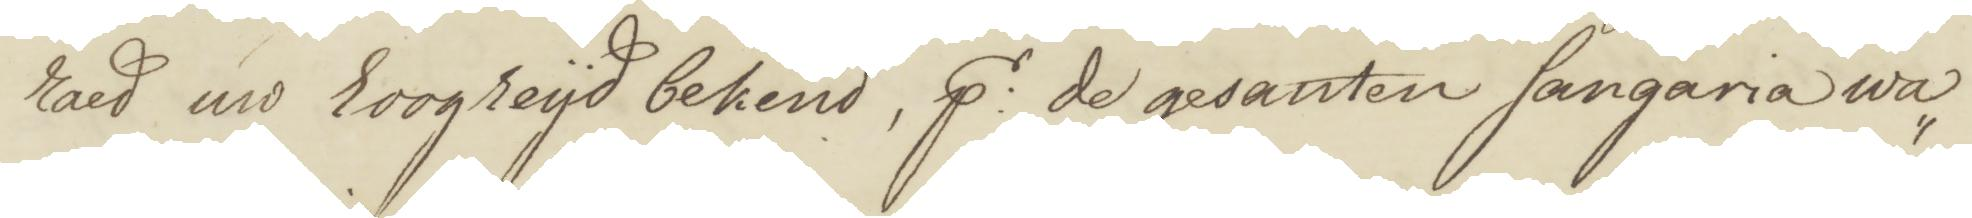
raed uw hoogheijd bekend, p:r de gesanten sangaria wa„
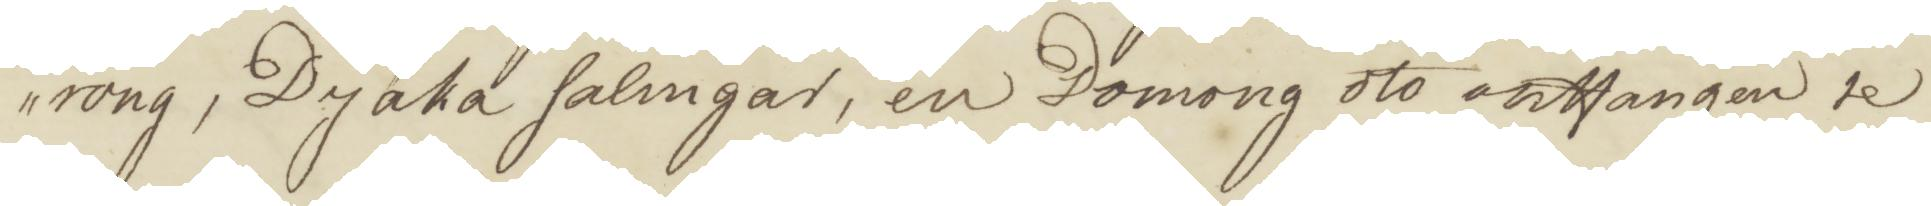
„rong, Dijaka salingar, en Domong oto ontfangen te
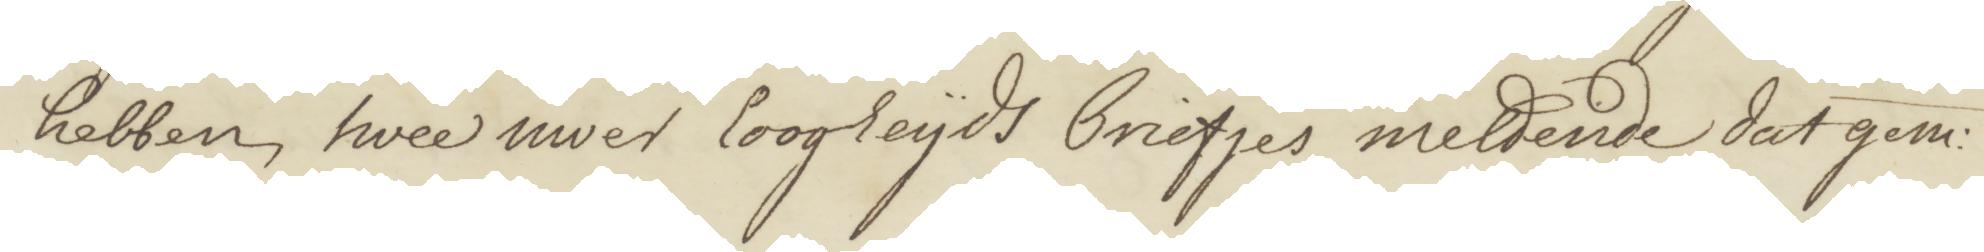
hebben twee uwer hoogheijds briefjes meldende dat gem:
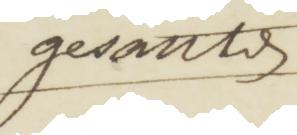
gesanten
